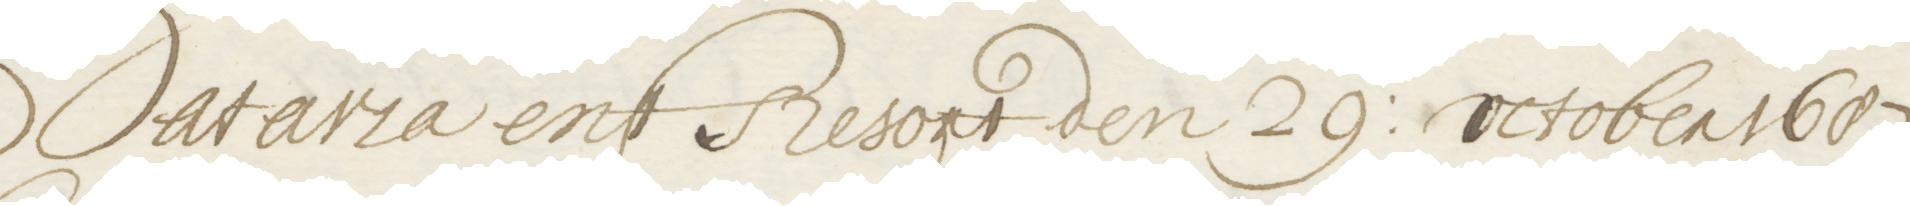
Batavia en t Resort den 29:e october 1687
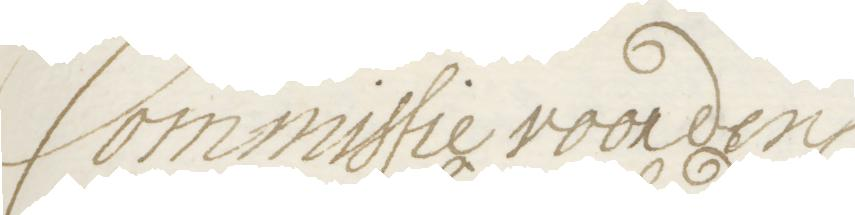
Commissie voor den
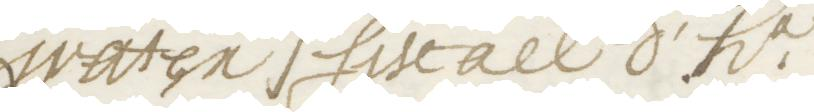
water fiscal d’ h:r
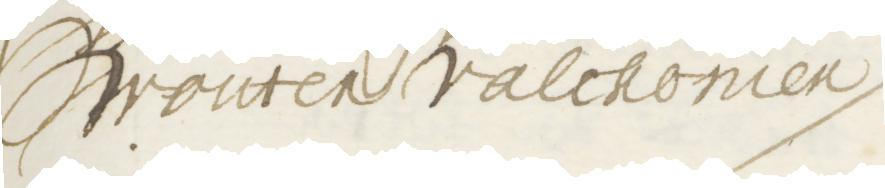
wouter valckonier
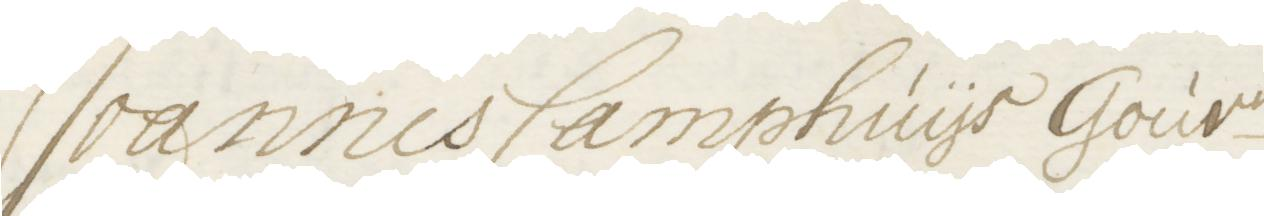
Joannis Camphuijs Gouv:r
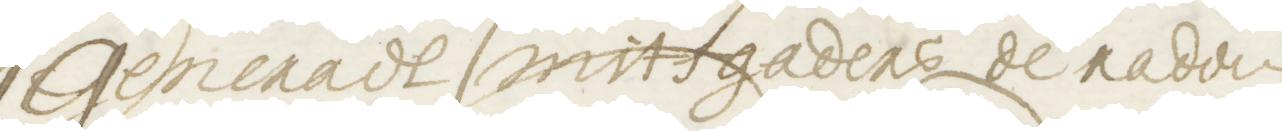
Generael mitsgaders de raden
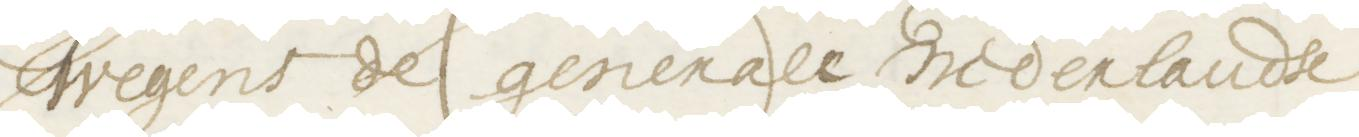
wegens de generale nederlandse
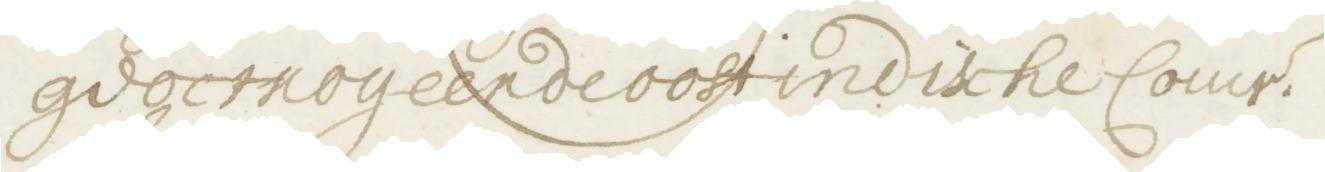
geoctroyeerde oost indische comp:e
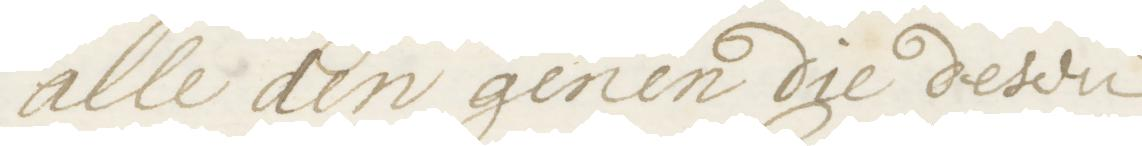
alle den genen die desen
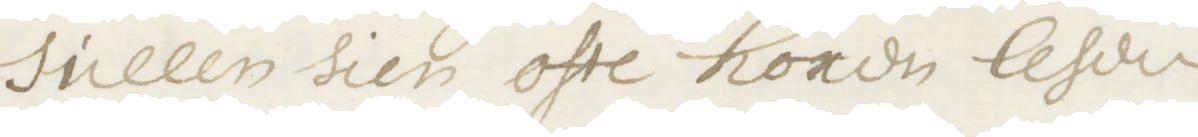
sullen sien ofte horen lesen
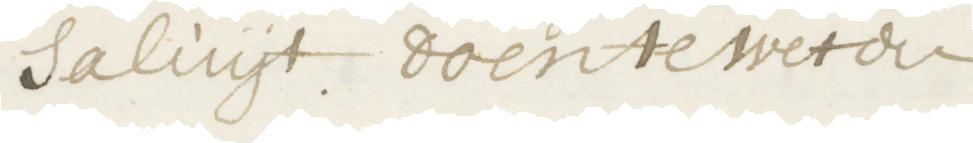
saluijt doen te weten
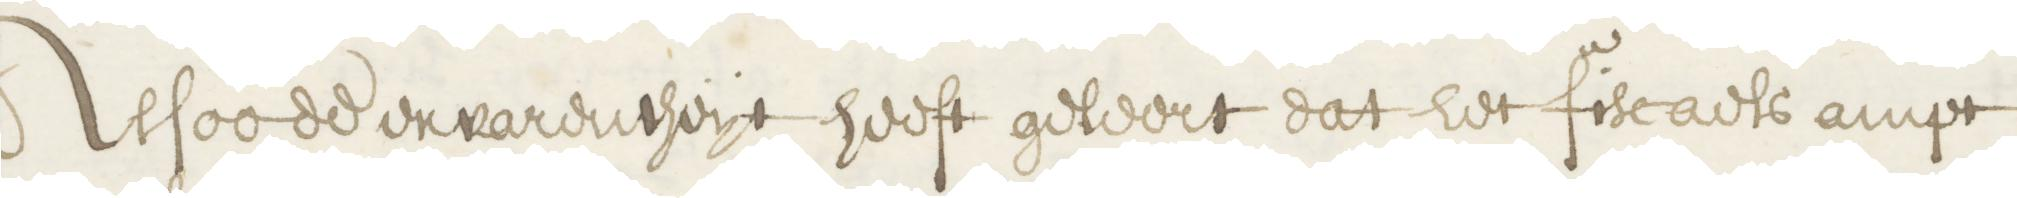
Alsoo de ervarentheijt heeft geleert dat het fiscaels ampt
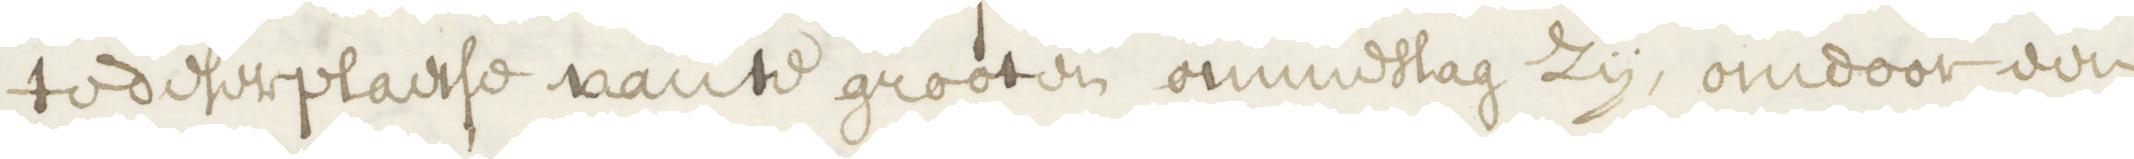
te deser plaetse van te grooten ommeslag Zij, om door een
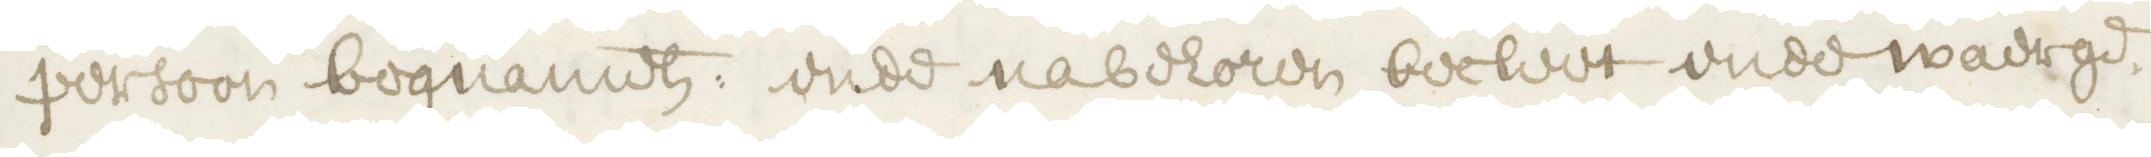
persoon bequamelijk ende nabehoren becleet ende waerge„
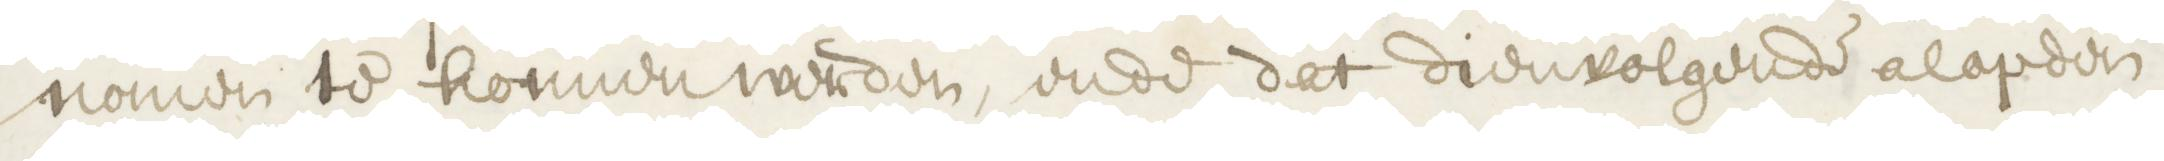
nomen te konnen werden, ende dat dien volgende al op den
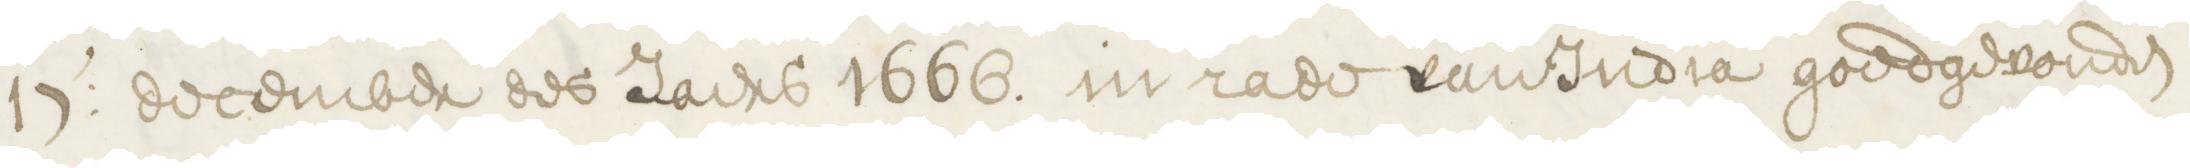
17:' december des Jaers 1666. in rade van India goed gevonden
